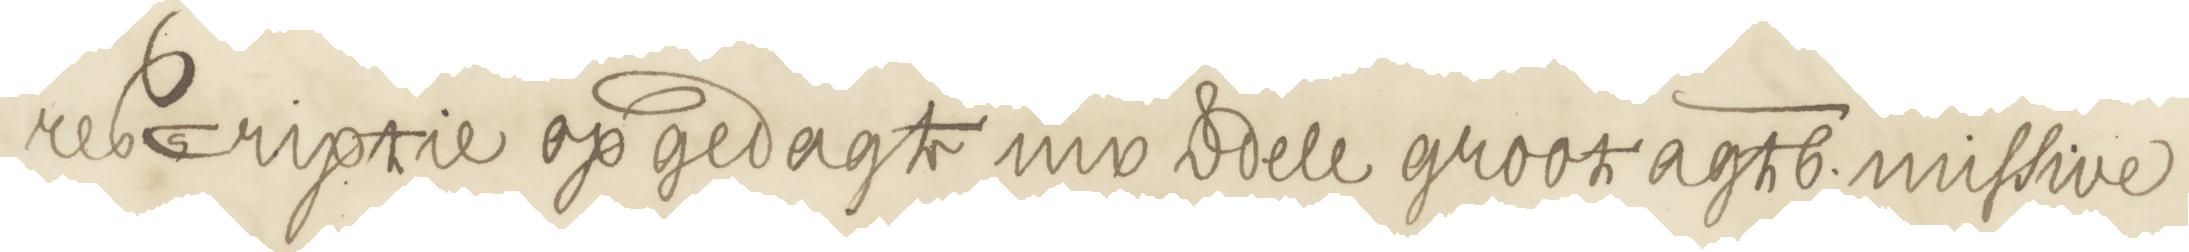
rescriptie op gedagte uw Edele groot agtb: missive
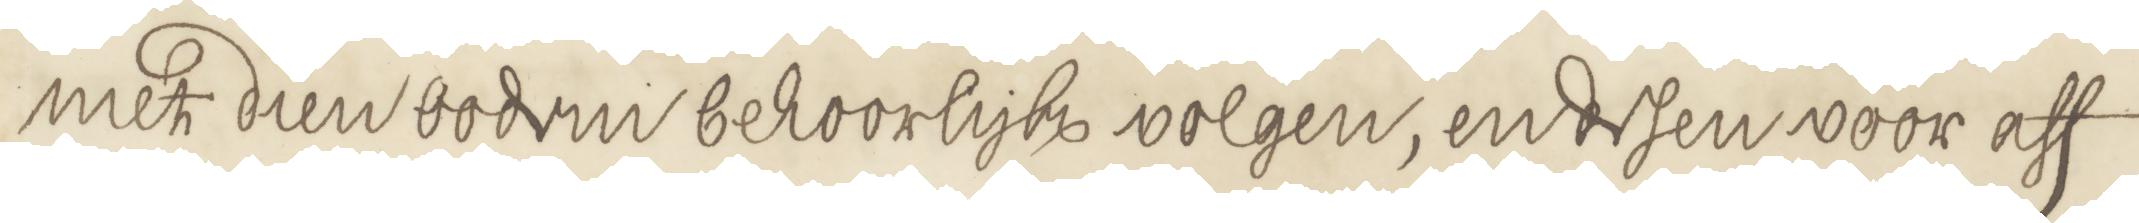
met dien bodem behoorlijk volgen, en desen voor aff
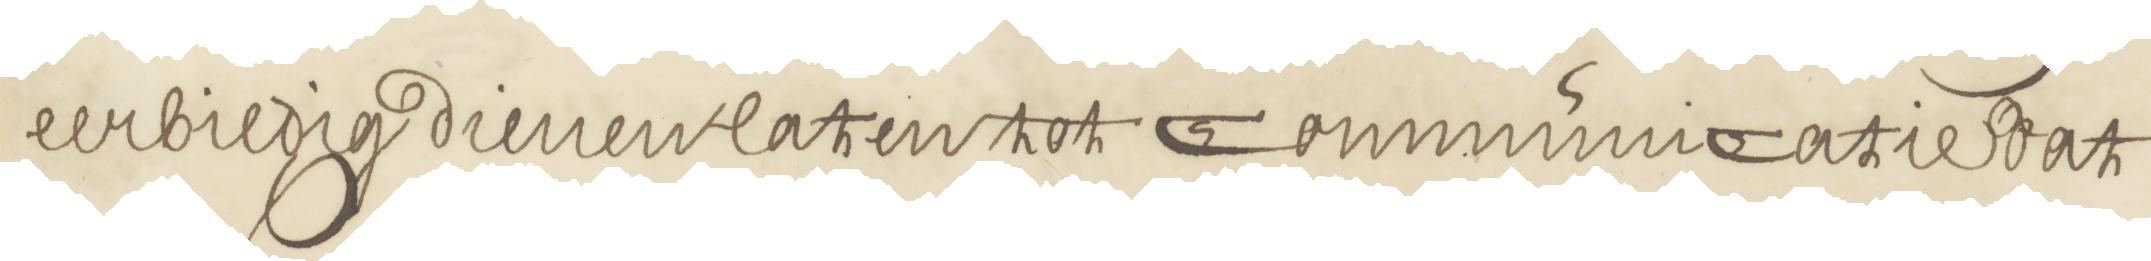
eerbiedig dienen laten tot communicatie dat
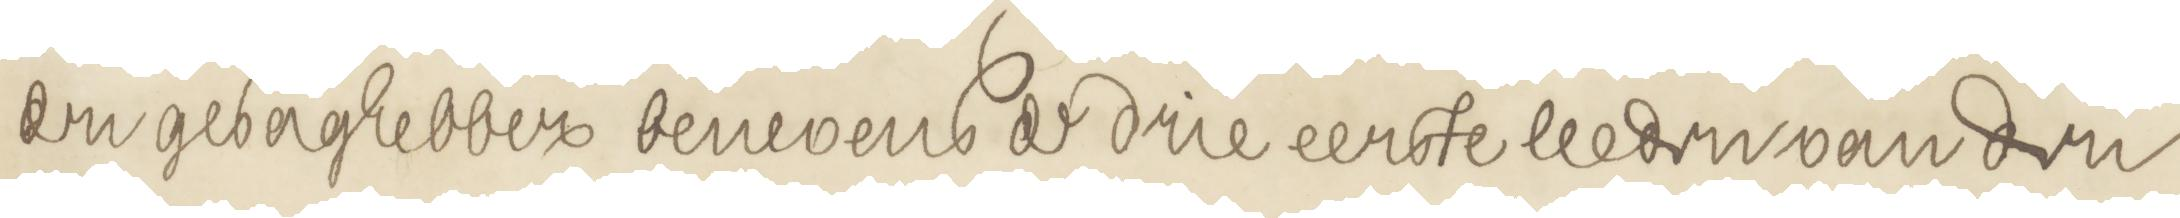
den gesaghebber benevens de drie eerste leeden van den
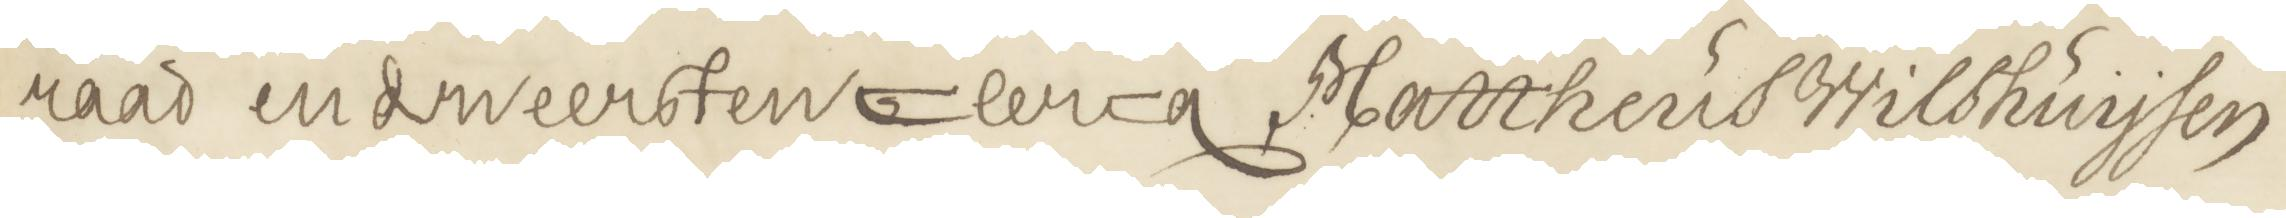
raad en den eersten clercq Mattheus Wilshuijsen
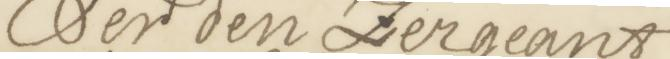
Per den Zergeant
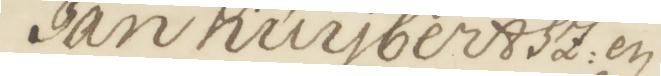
Ian huijbertsz: en
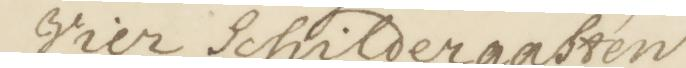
vier schildergasten
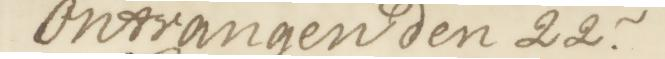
ontrangen den 22.e
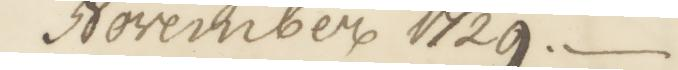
November 1729. —
